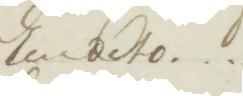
Een dito. . . . . . . . .
